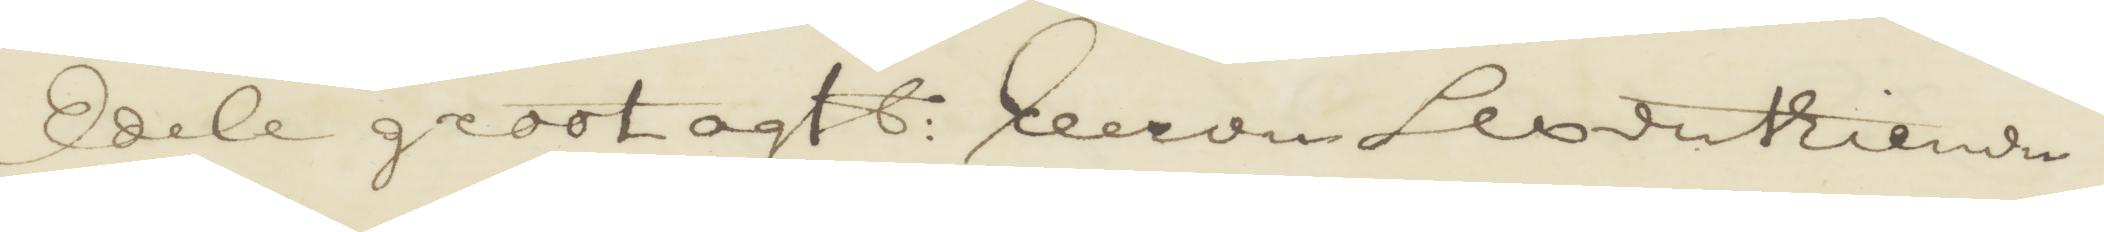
Edele groot agtb: heeren seventhienen
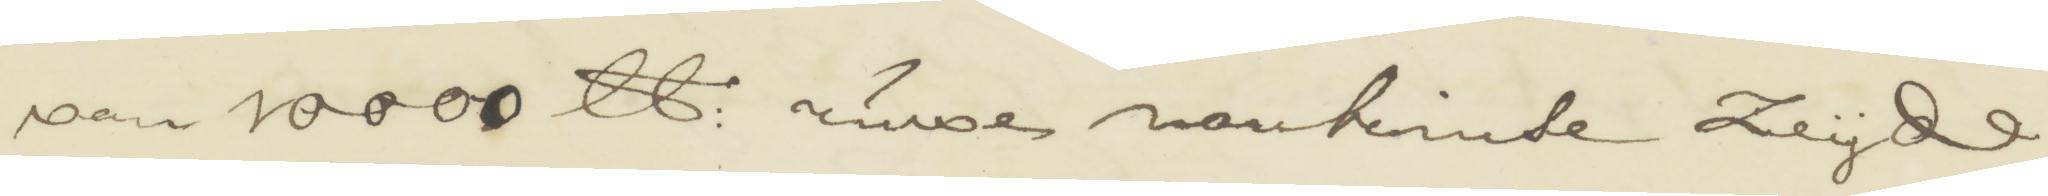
van 10000 lb: ruwe nankinse zeijde,
